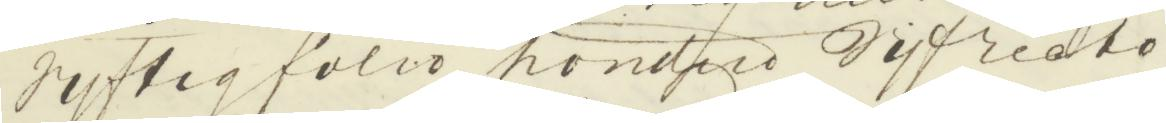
vyftigfolio honderd Vijfrecto
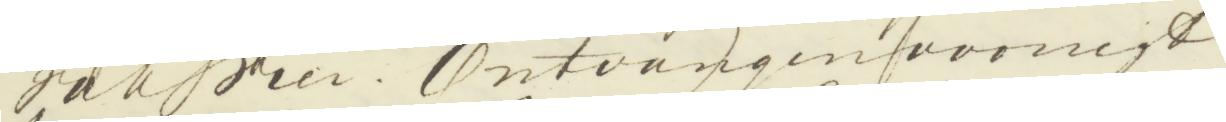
vakvier. Ontvangenvoorregt
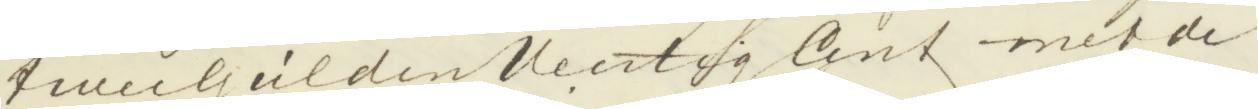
tweeGuldenVeertig Cent metde
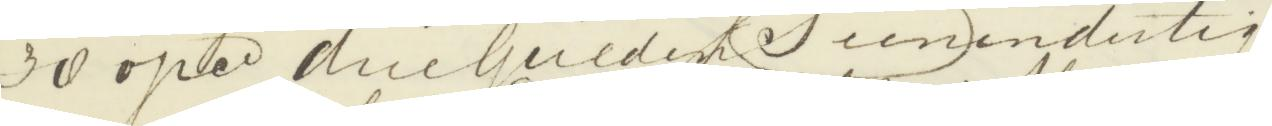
38 opc drieGuldens eenendertig
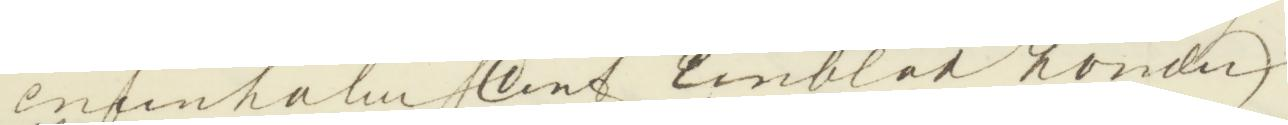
eneenhalve Cent EenbladZonder
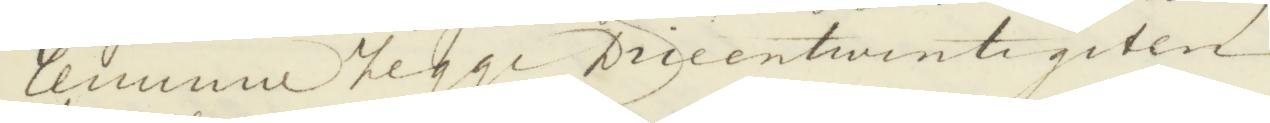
renvooi Zegge Drieentwintigsten
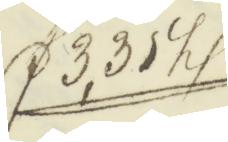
f 3,31½
